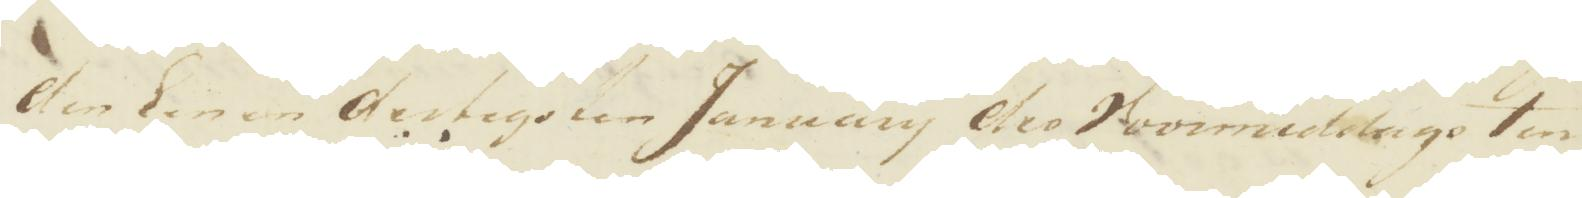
den Een en dertigsten January des Voormiddags ten
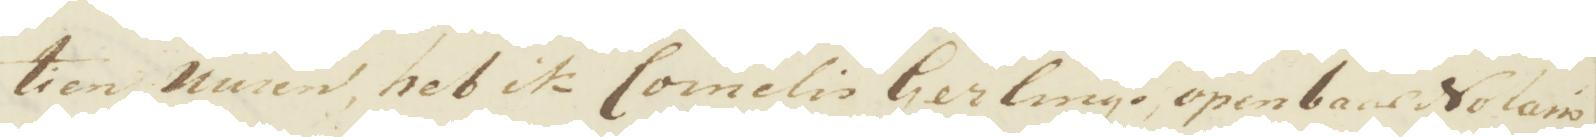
tien uuren, heb ik Cornelis Gerlings, openbaar Notaris
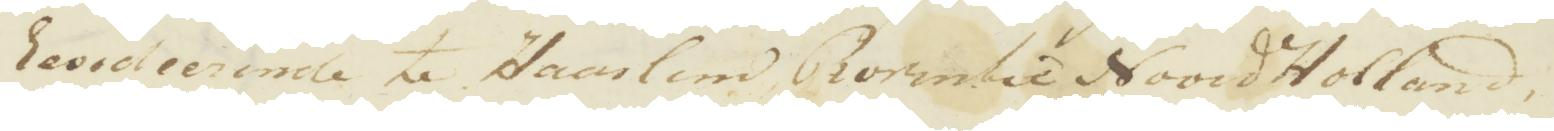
resideerende te Haarlem Provintie Noord Holland,
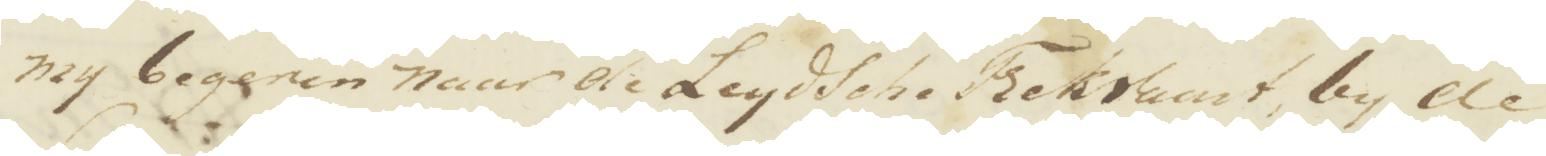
my begeven naar de Leydsche Trekvaart, by de
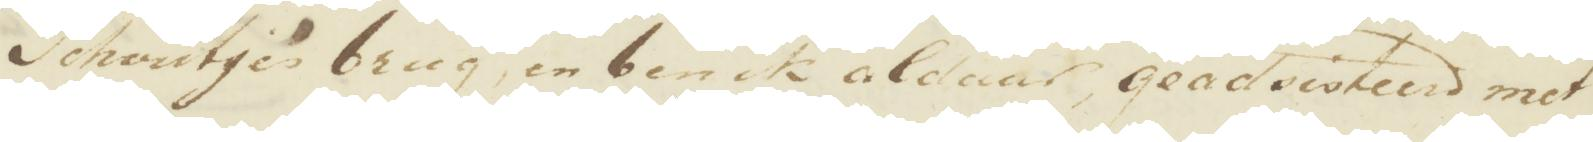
Schoutjes brug, en ben ik aldaar, geadsisteerd met
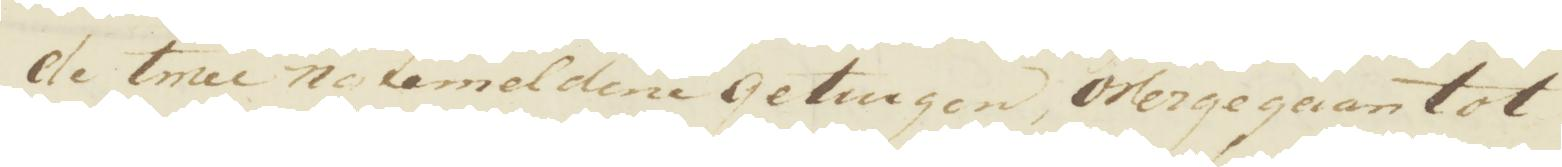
de twee natemeldene getuigen, overgegaan tot
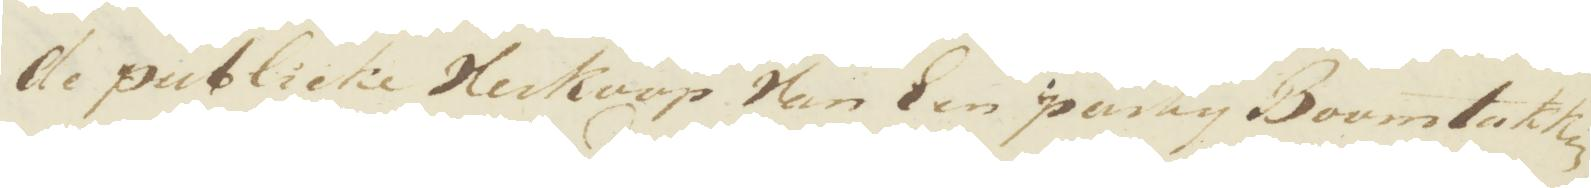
de publieke Verkoop van Een party Boomtakken
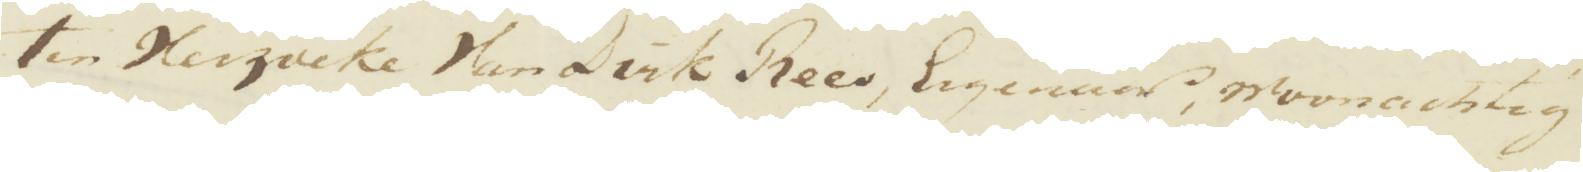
ten Verzoeke Van Dirk Rees, Eigenaar, woonachtig
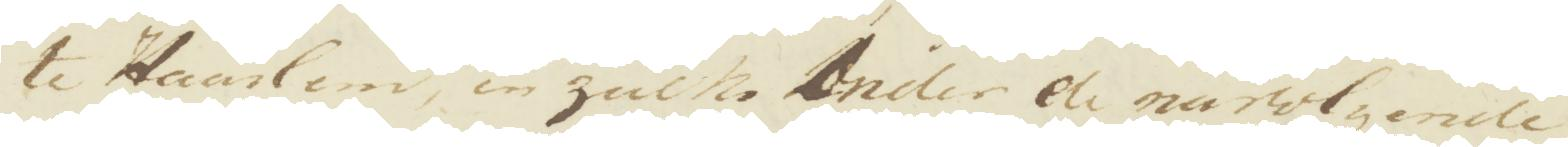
te Haarlem, en zulks Onder de navolgende
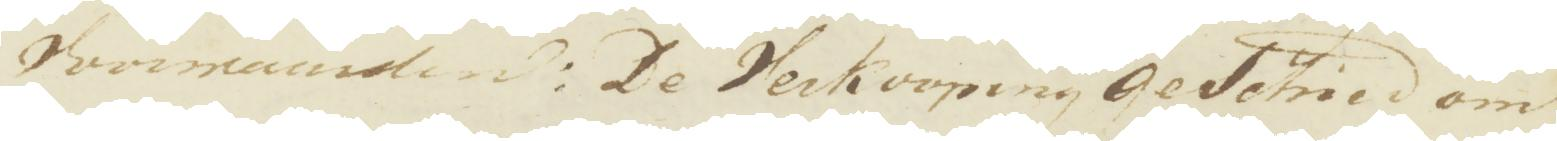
voorwaarden: De Verkooping geschied om
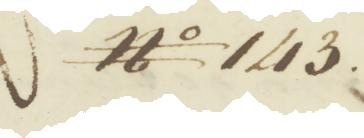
N=o 143.
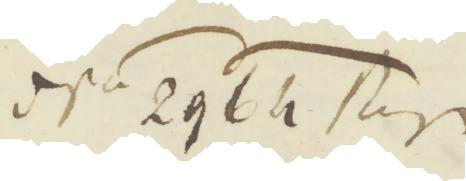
No 2964 Reg
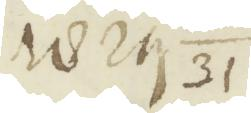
1829 1/31
